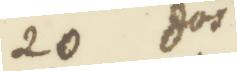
20 d:os
